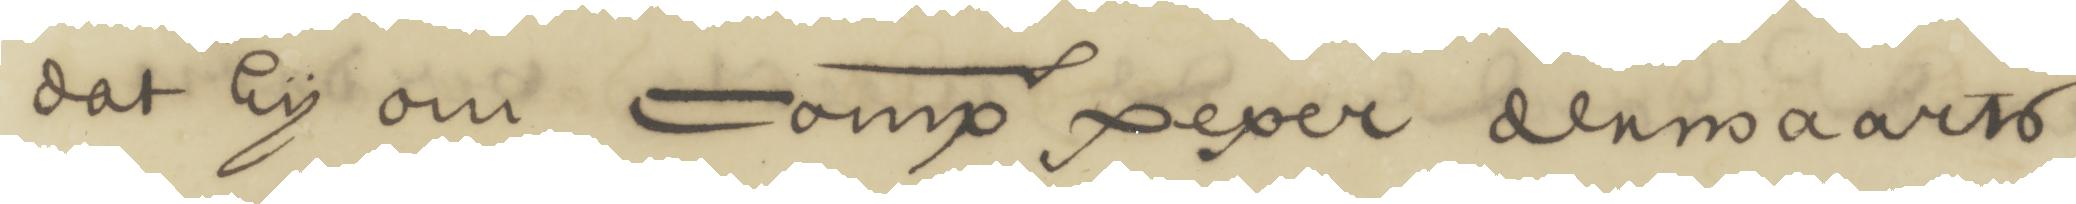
dat hij om Comps peper derwaarts
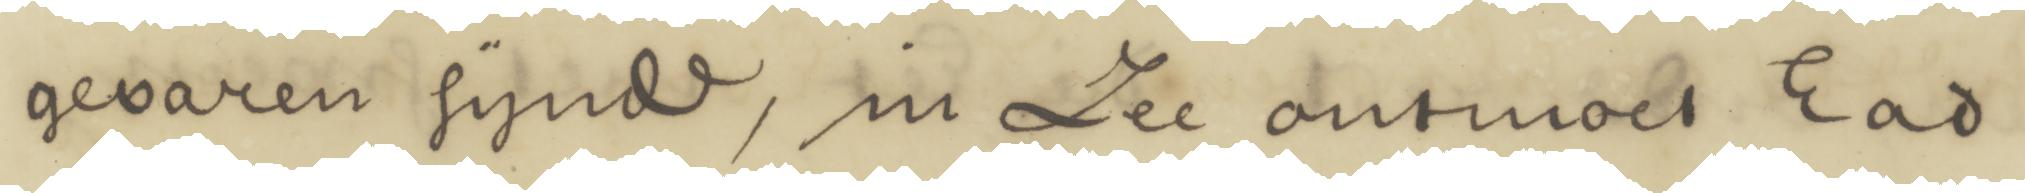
gevaren sijnde, in zee ontmoet had
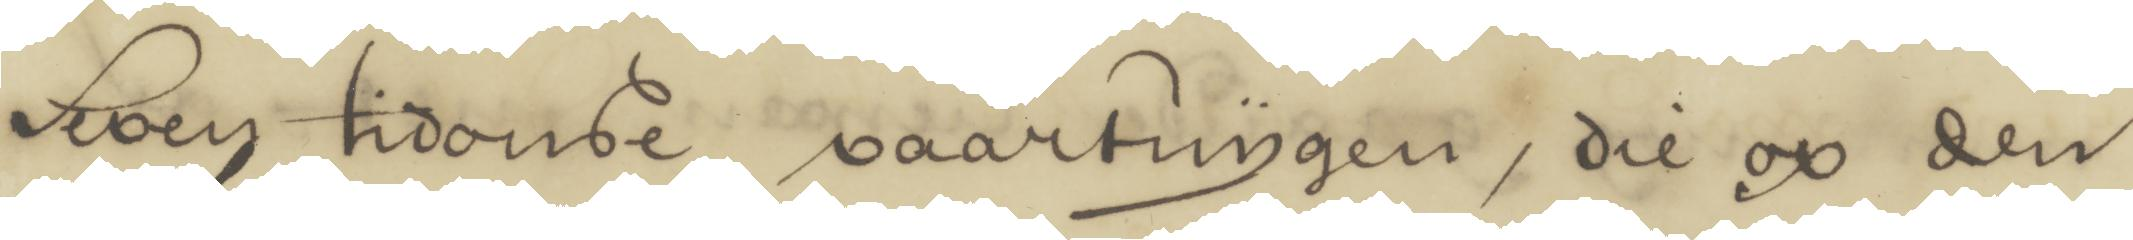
seven tidonse vaartuijgen, die op den
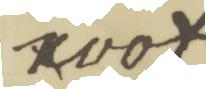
roof
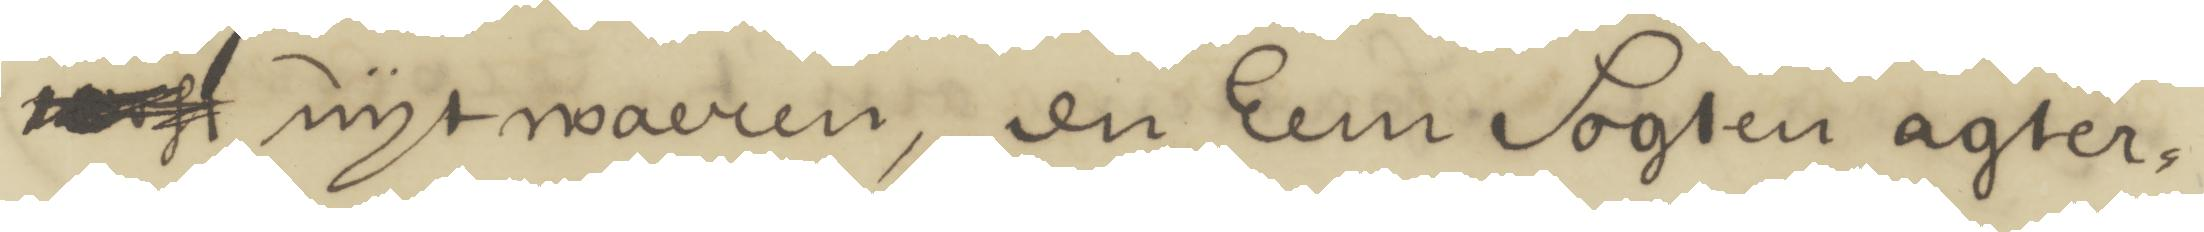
rooft uijtwaeren, en hem sogten agter=
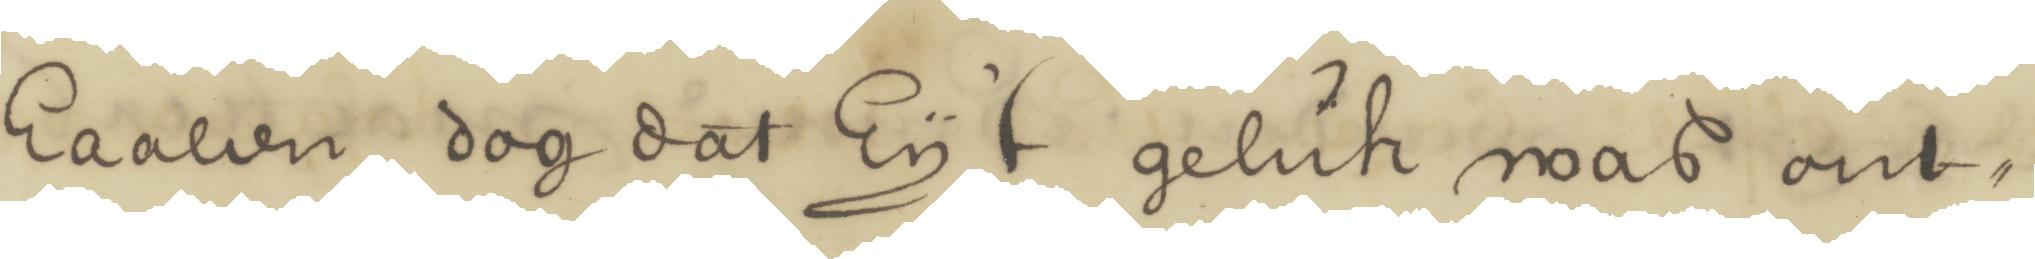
haalen dog dat hij ’t geluk was ont„
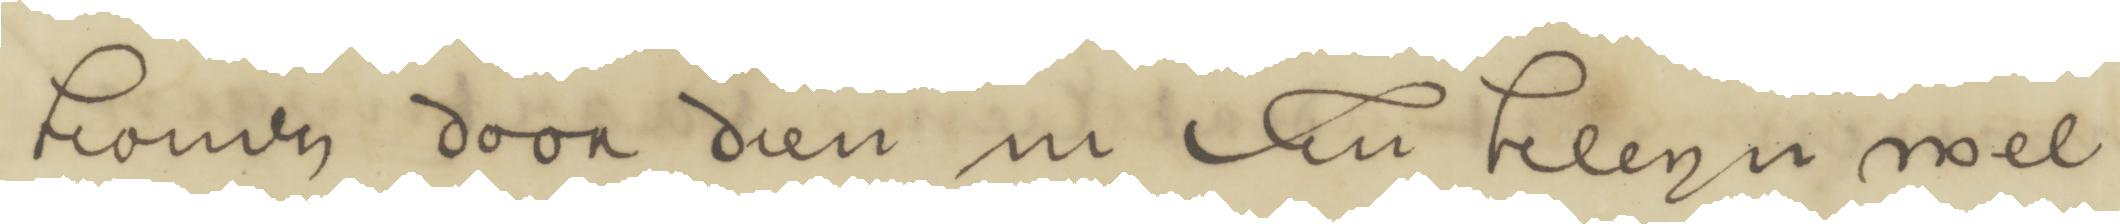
komen door dien in Een kleyn wel
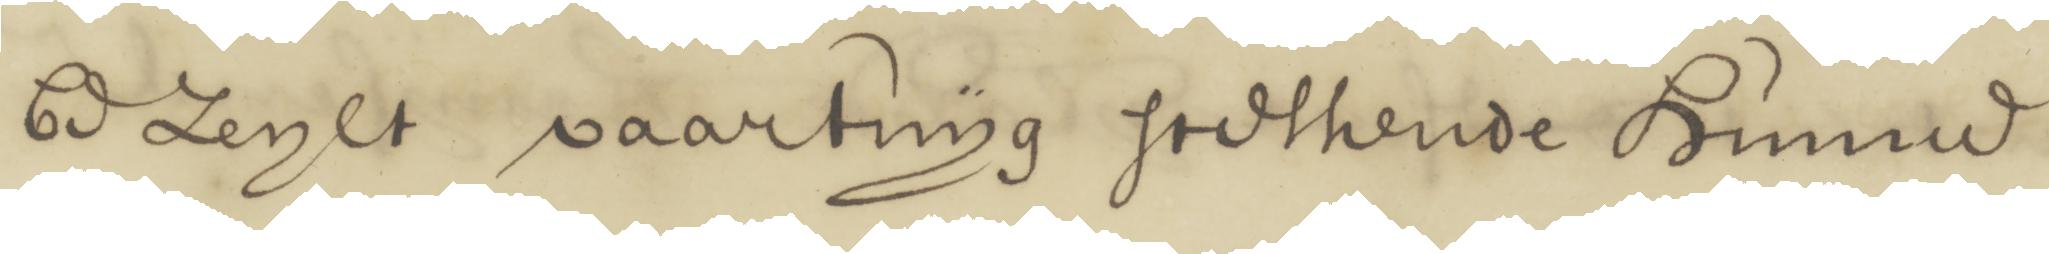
bezeylt vaartuijg stellende hunne
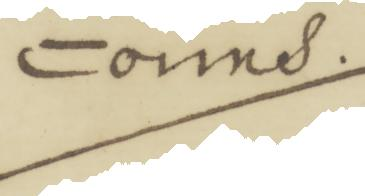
cours.
